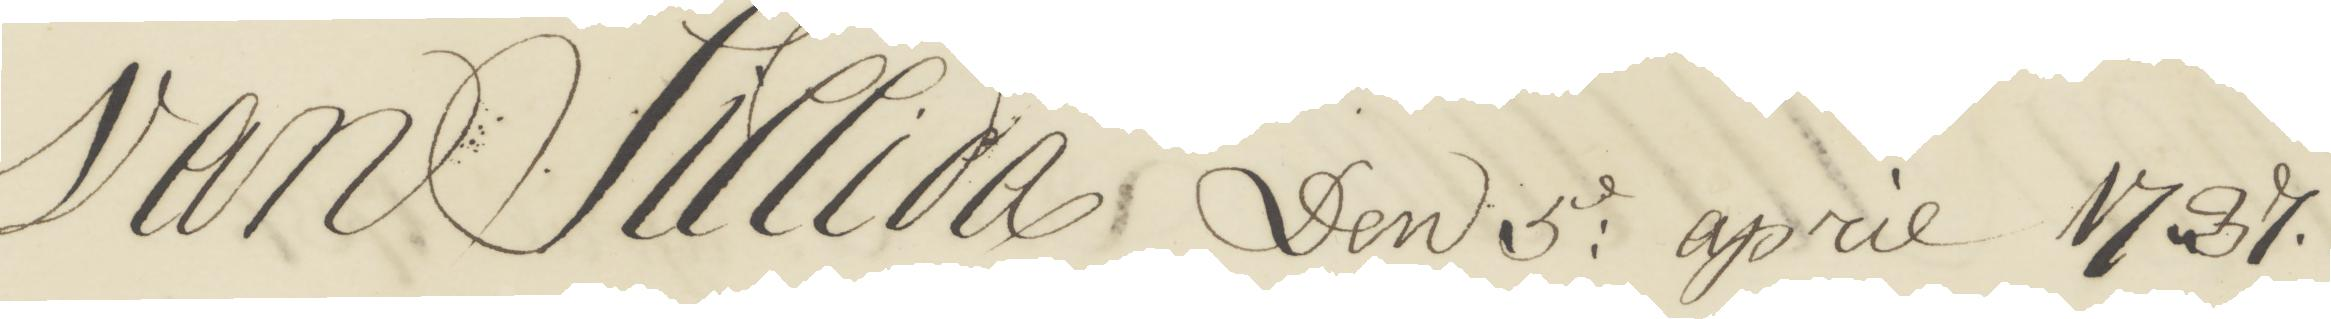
Van Sillida Den 5:e april 1737.
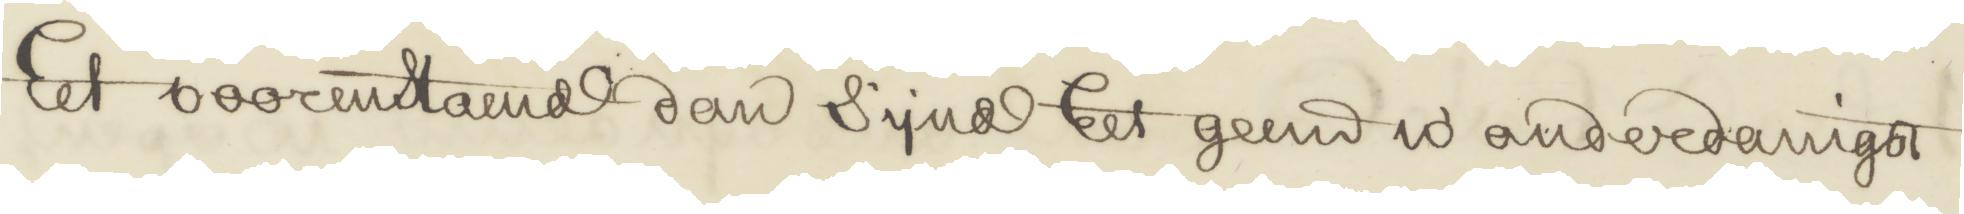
het voorenstaende dan sijnde het geene w' onderdanigst
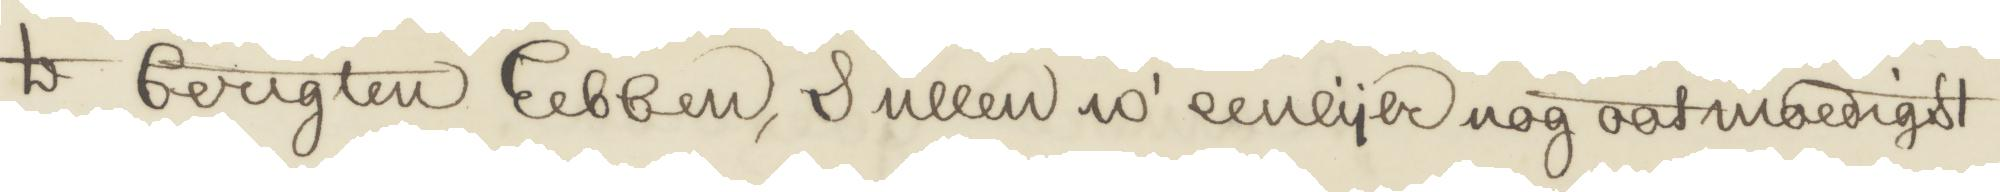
te berigten hebben, sullen w' eenlijk nog ootmoedigst
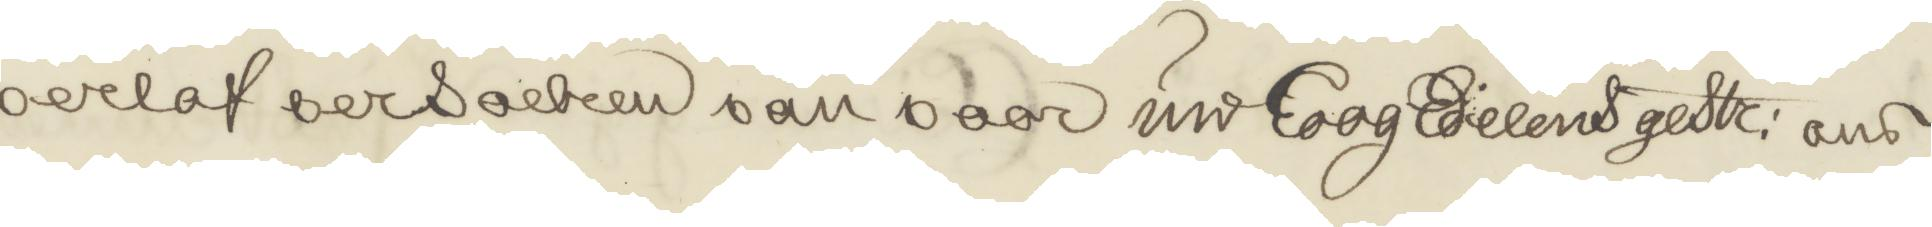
verlof versoeken van voor uw hoog Edelens gestr: ons
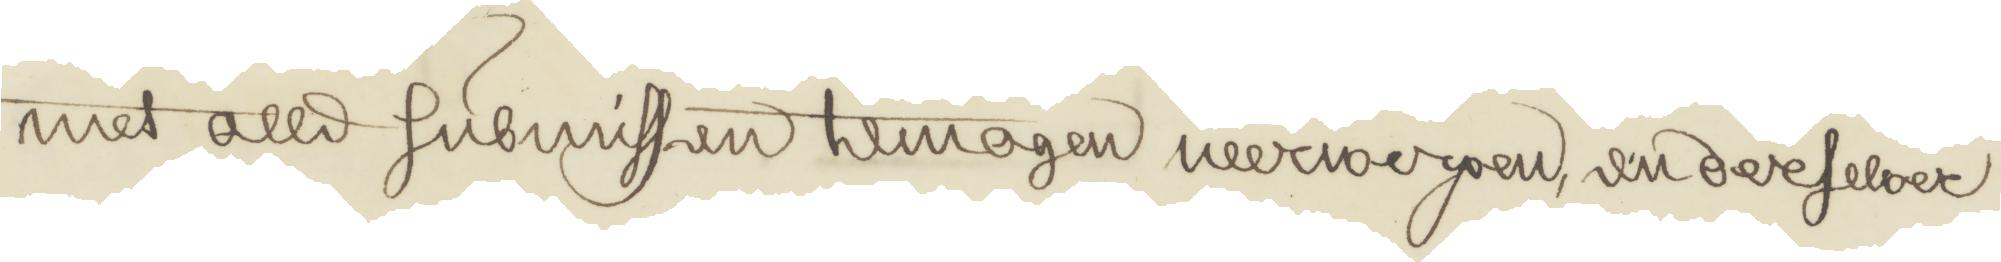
met alle submissen temogen neerwerpen, en derselver
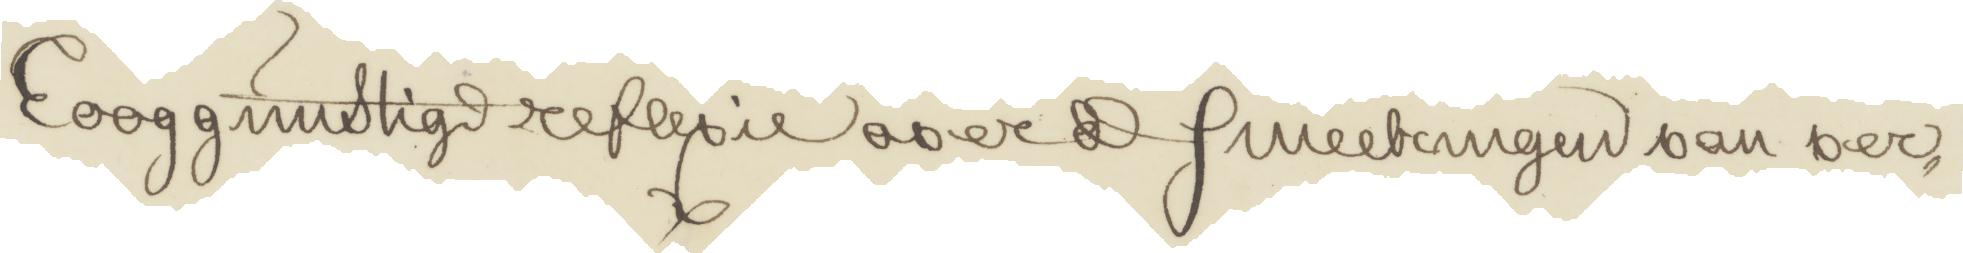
hooggunstige reflexie over de smeekingen van ver„
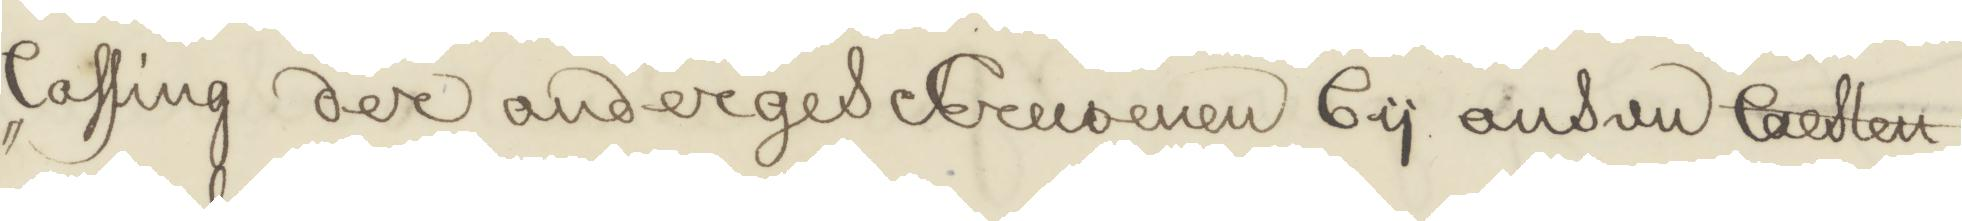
„lossing der andergeschreevenen bij onsen laesten
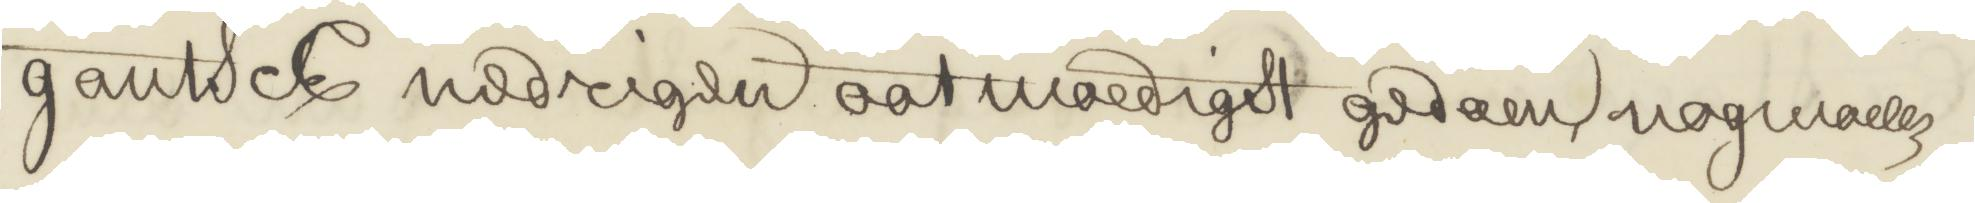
gantsch nedrigen ootmoedigst gedaen, nogmaelen
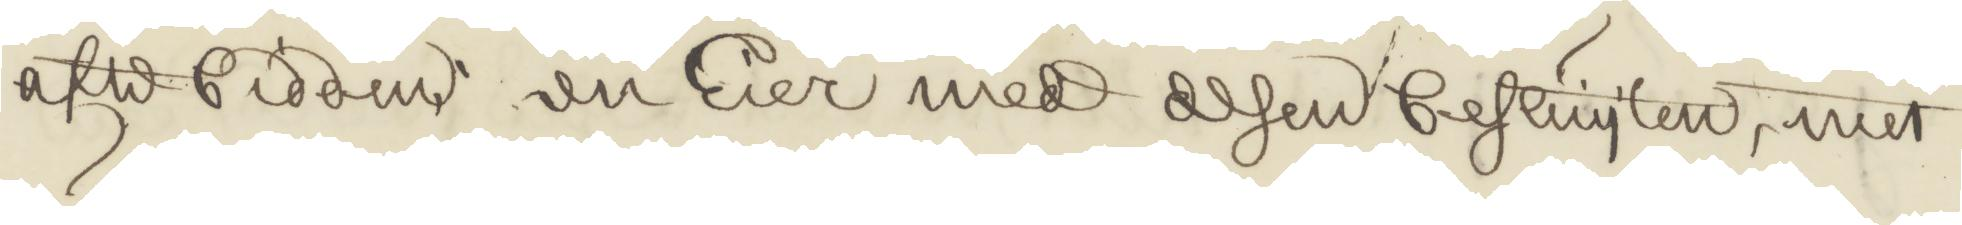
afte bidden, en hier mede desen besluijten, met
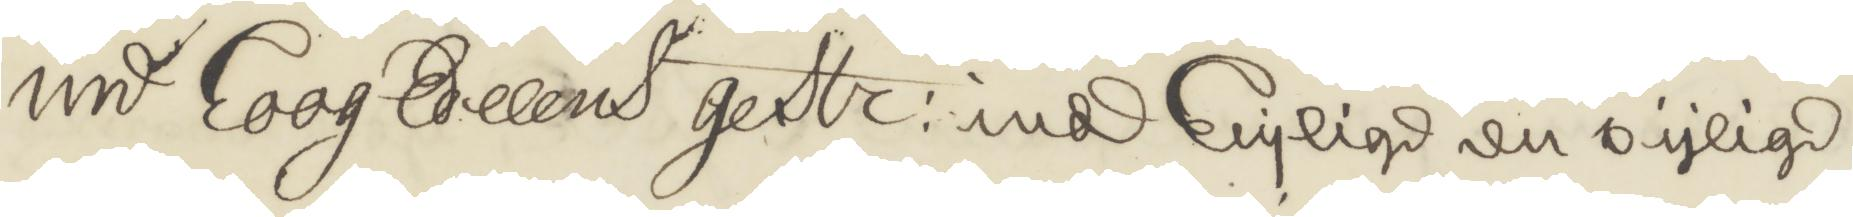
uw hoog Edelens gestr: in de Eijlige en vijlige
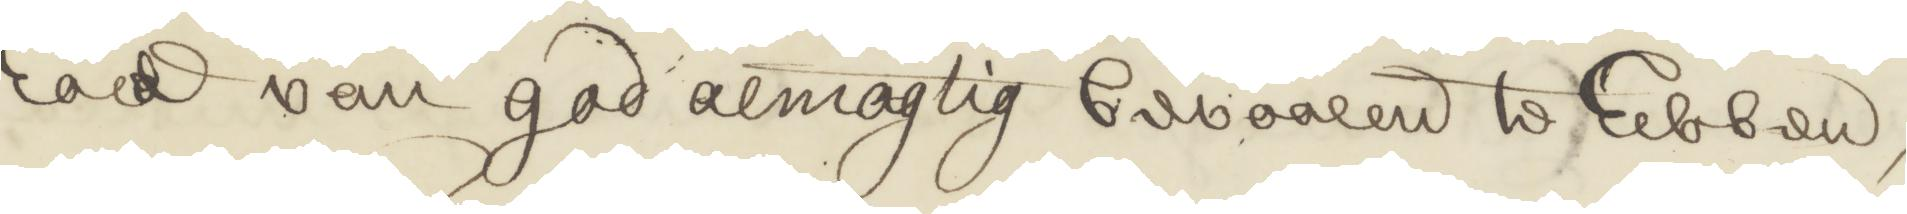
haede van god almagtig bevoolen te hebben,
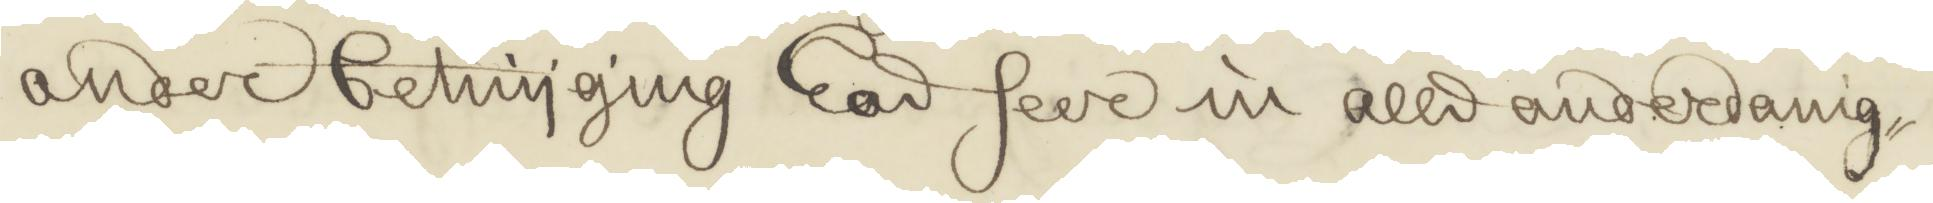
onder betuijging had seer in alle anderdanig„
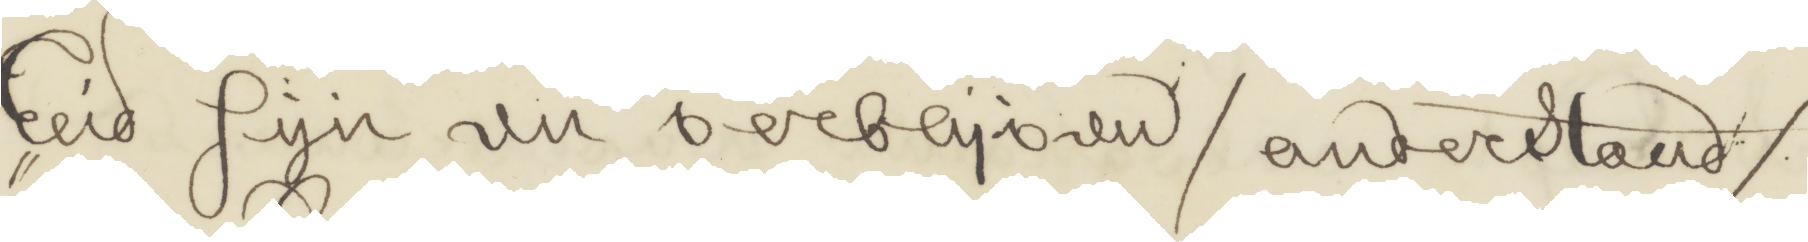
„heid sijn en verblijven /onderstaad/
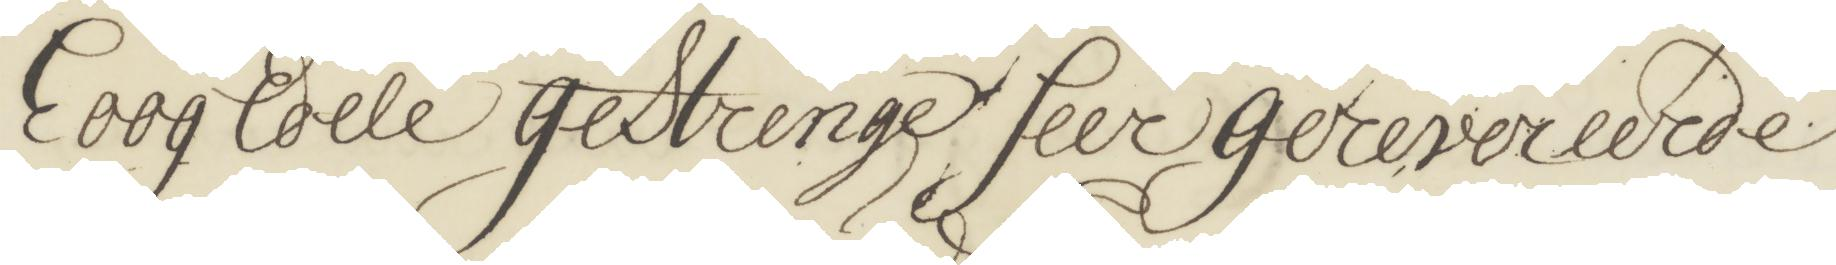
hoog Edele gestrenge seer gerevereerde
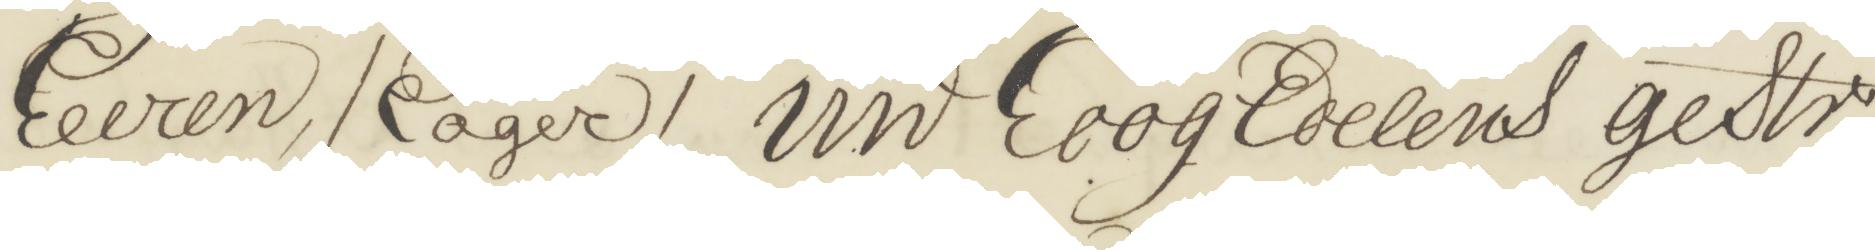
heeren, /lager/ uw hoogEdelens gestr.
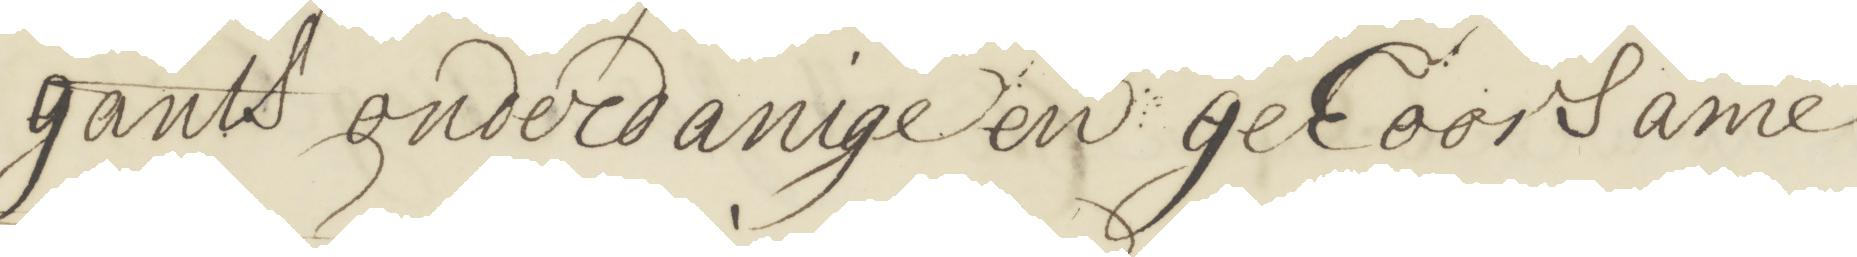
gants onderdanige en: gehoorsame
